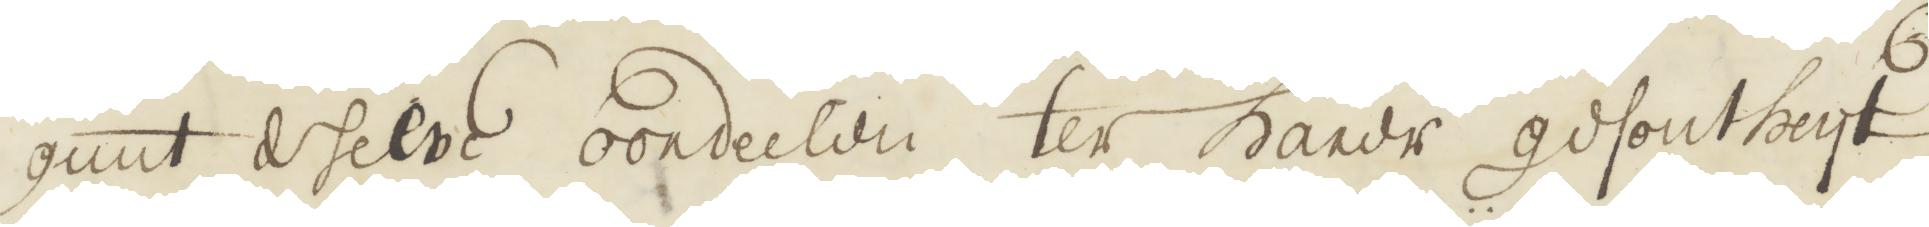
gunt deselve oordeelen ter harer gesontheyt
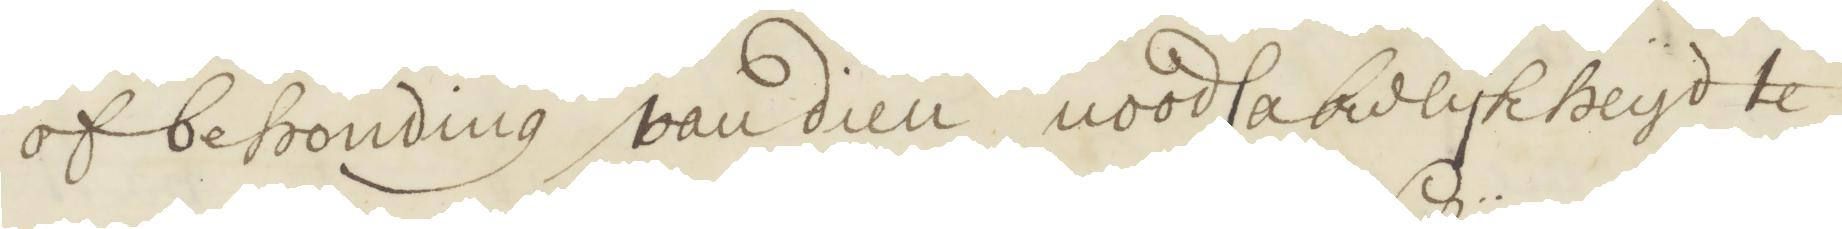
of behouding vandien noodsakelijkheijd te
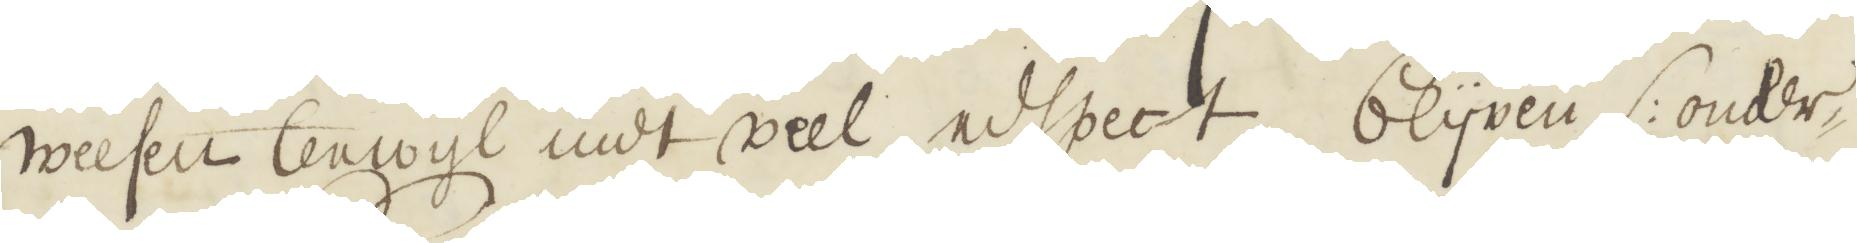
weesen terwijl met veel respect blijven (:onder„
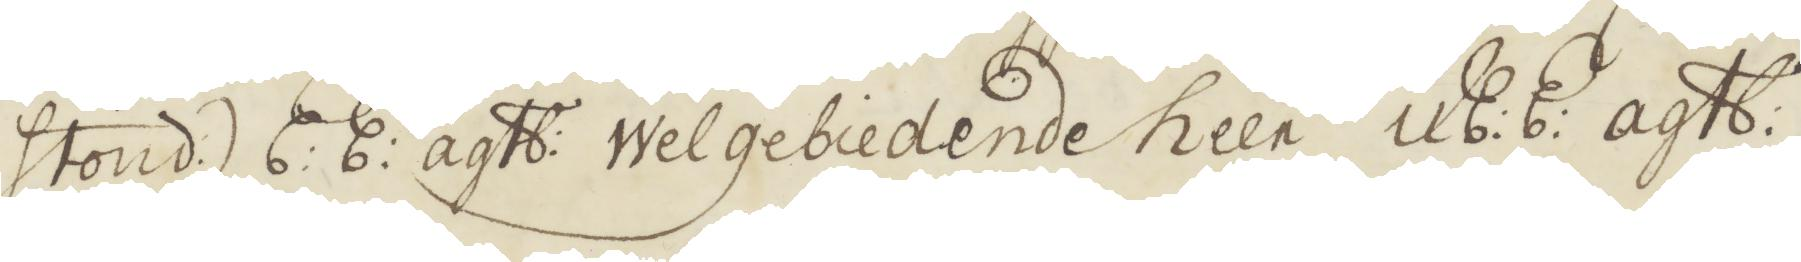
stond:) E: E: agtb: wel gebiedende heer uE: E: agtb:
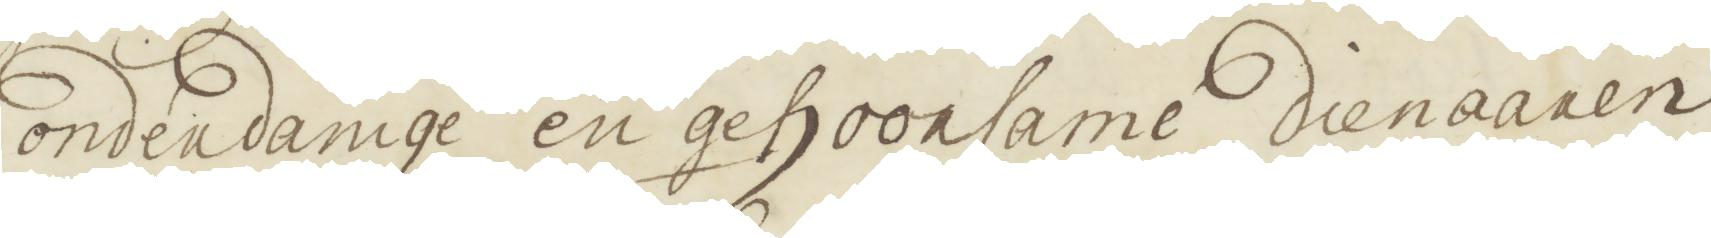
onderdanige en gehoorsame dienaaren
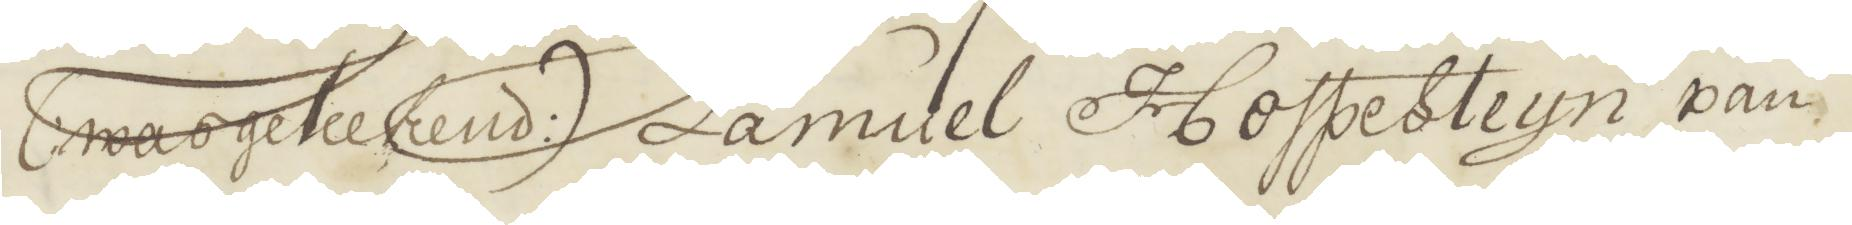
(:was geteekend:) Samuel Hoppesteyn van
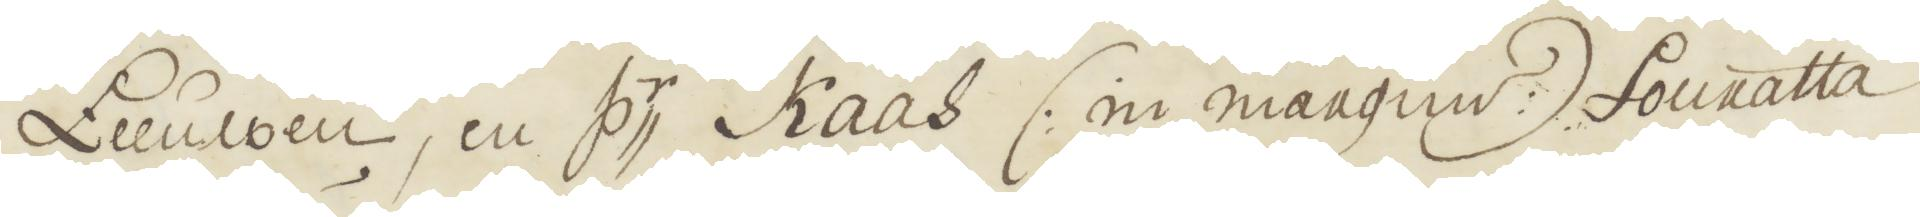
Leeuwen, en p„r Kaas (:in margine:) Souratta
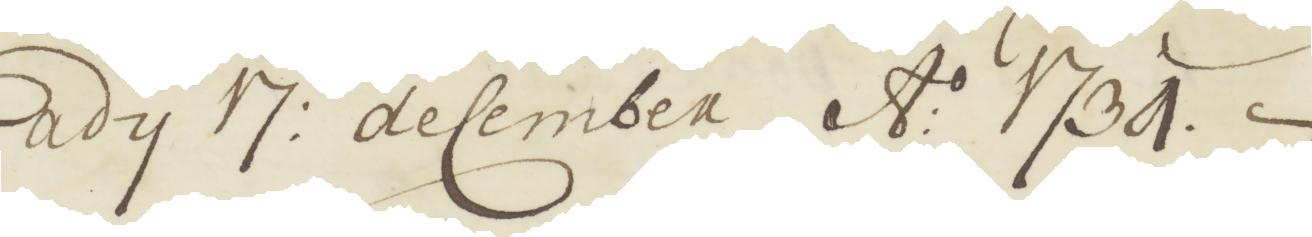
adij 17:e december A:o 1734. —
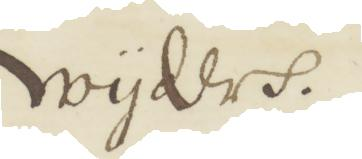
Wijders.
